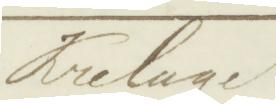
Krelage
